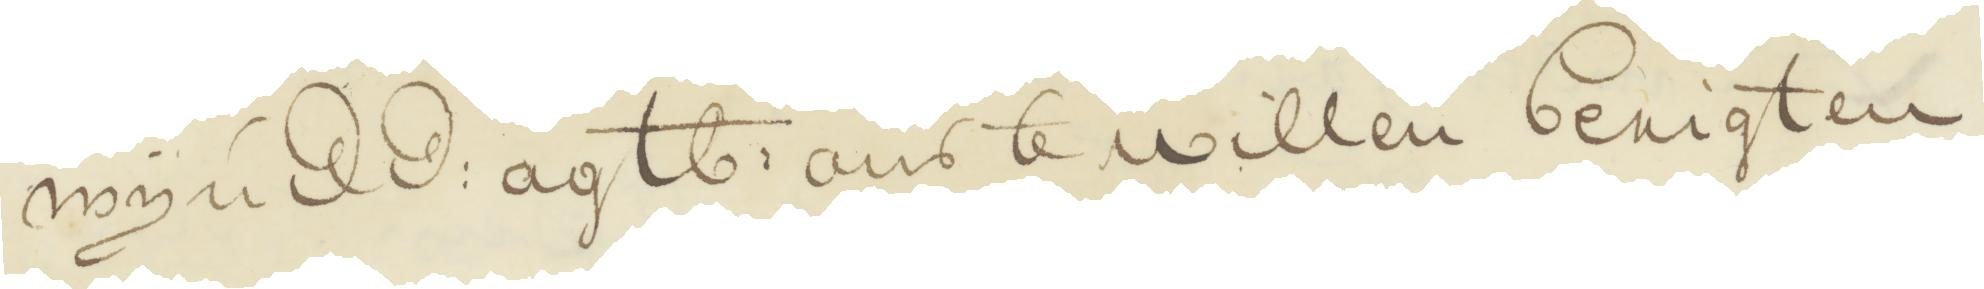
wij u EE: agtb: ons te willen berigten
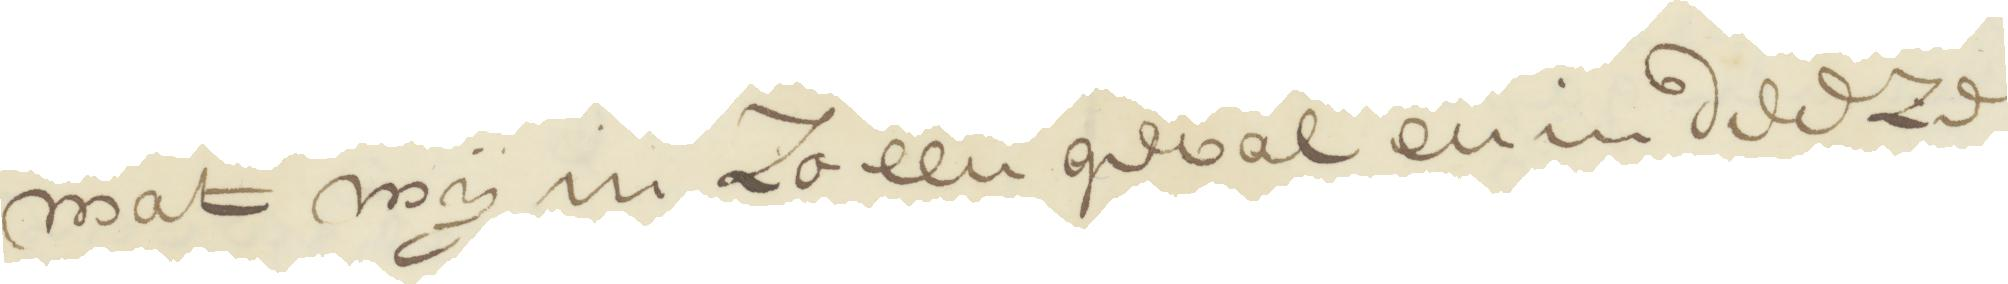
wat wij in zo een geval en in deeze
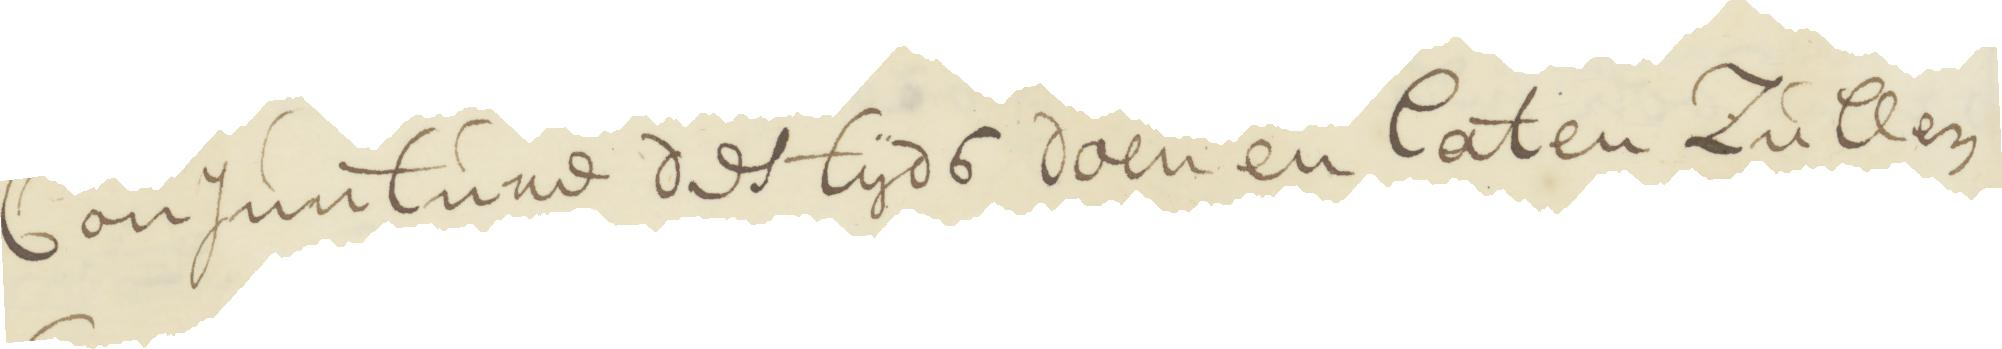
Conjunture des tijds doen en laten zullen
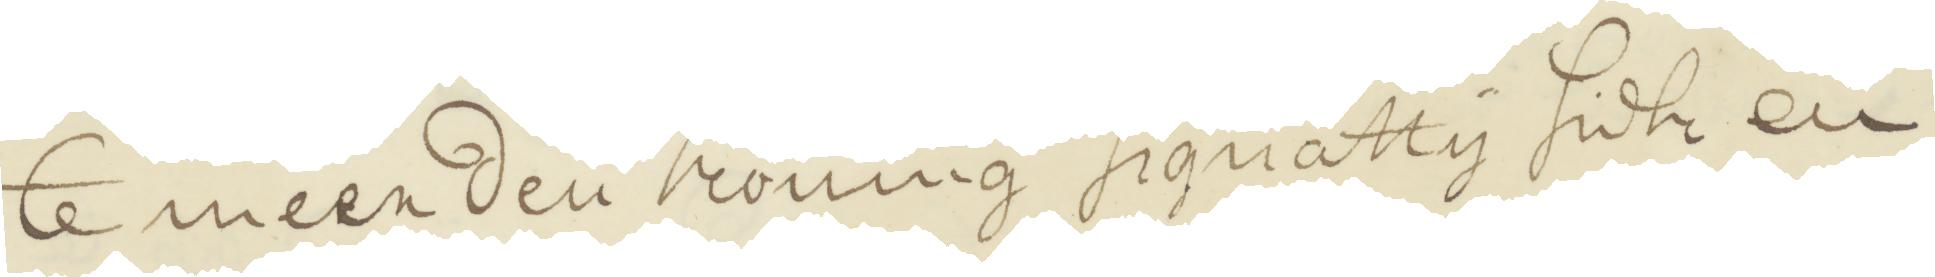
te meer den koning signattij siek en
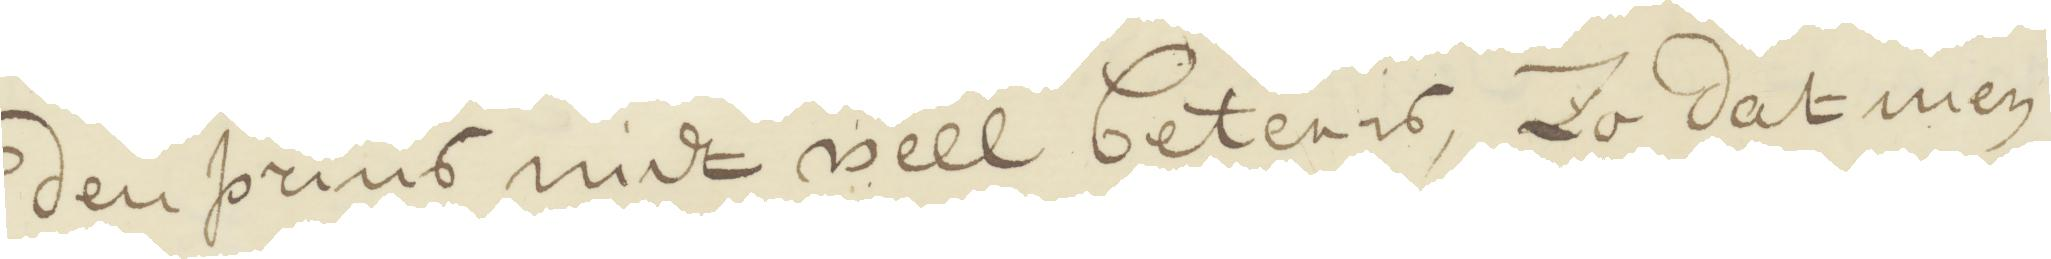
den prins niet veel beter is, zo dat men
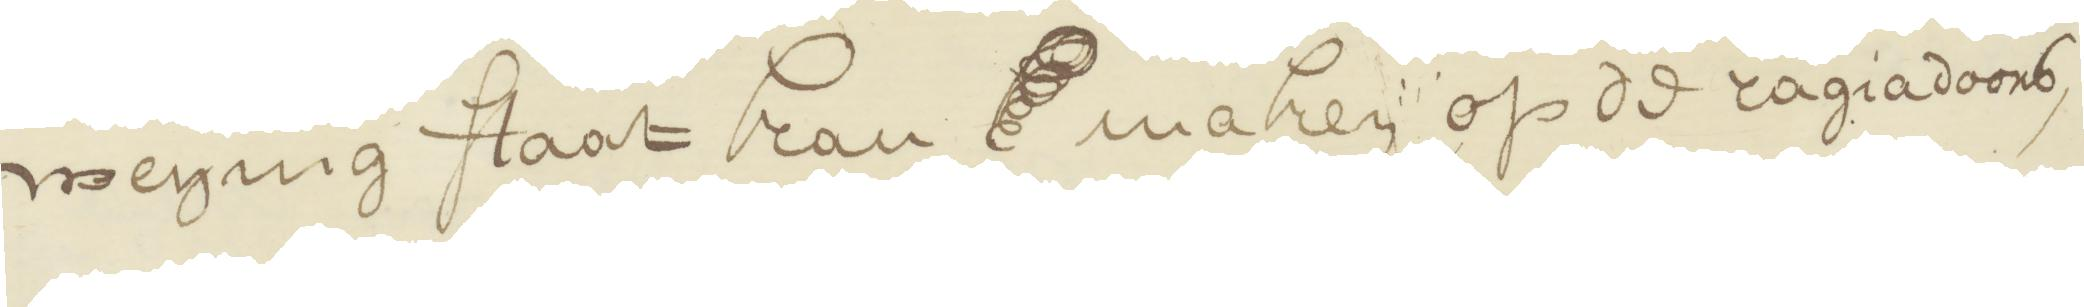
weijnig staat kan E maken op de ragiadoors,
